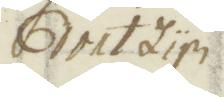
dort zijn
